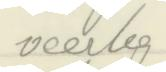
veerteg
